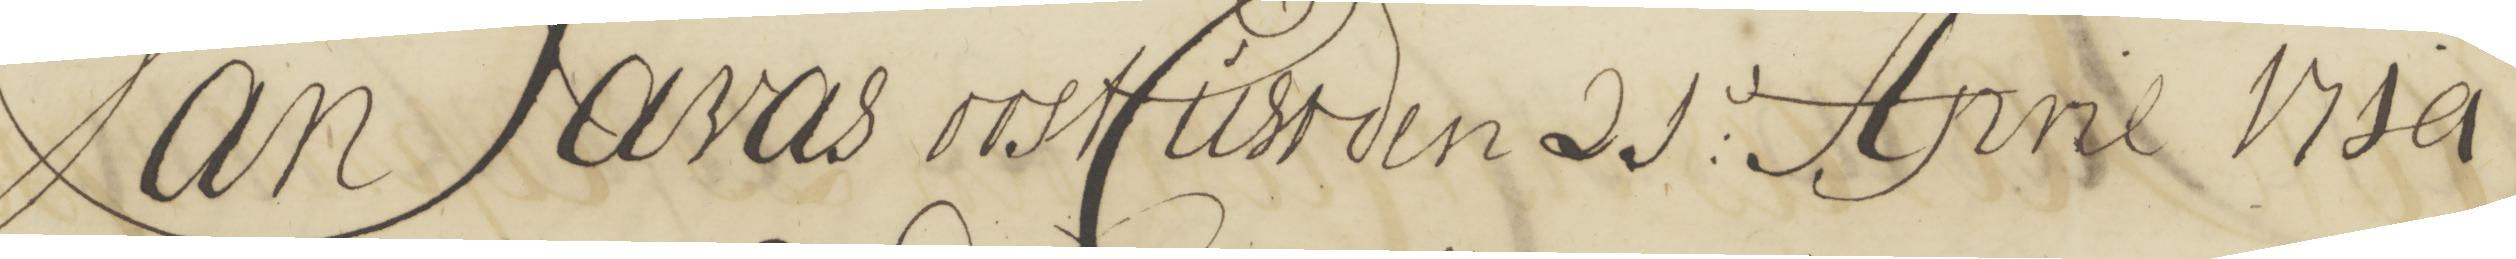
Van Javas oost Cust den 21:' April 1714
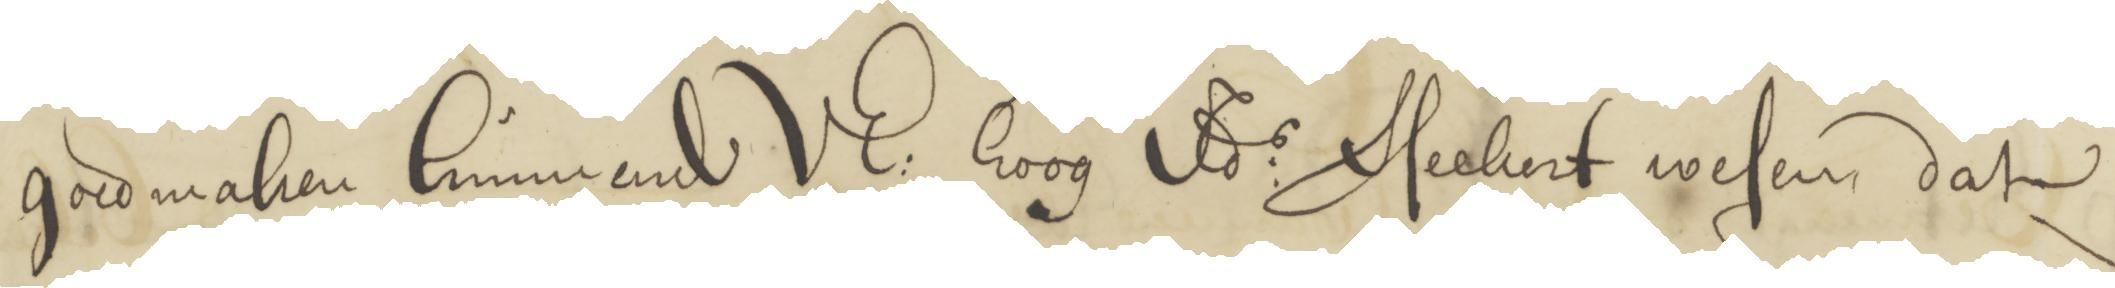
goed maken kunnende VE: hoog Ed:s verseekert wesen dat
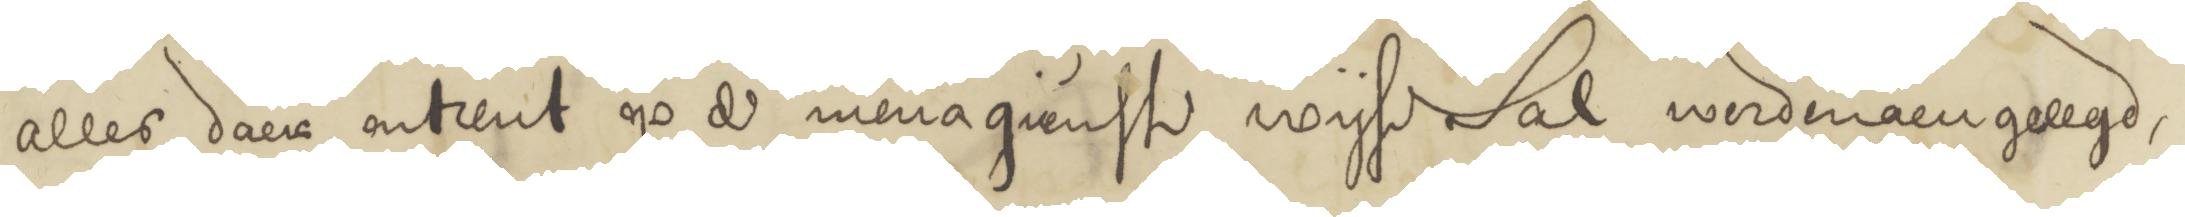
alles daer ontrent op de menagieuste wijse sal werden aen gelegd,
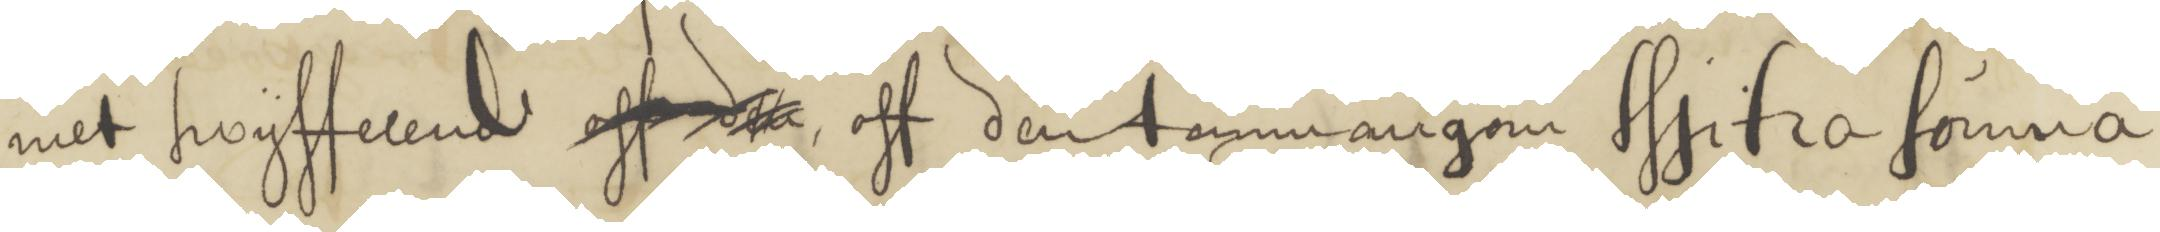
niet twijffelende off den, off den tommangom tsjitra souma
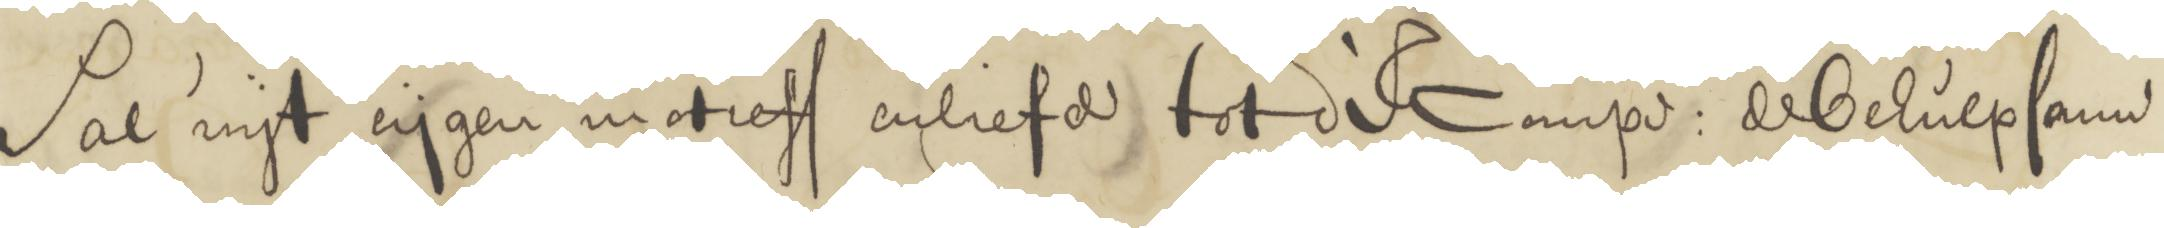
sal uijt eijgen motieff en liefde tot d'ECompe: de behulpsame
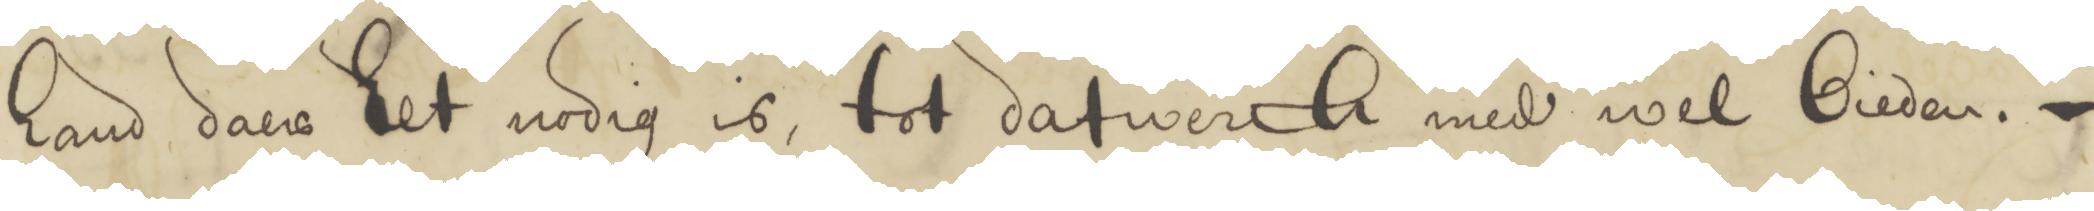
hand daer het nodig is, tot dat werck mede wel bieden. —
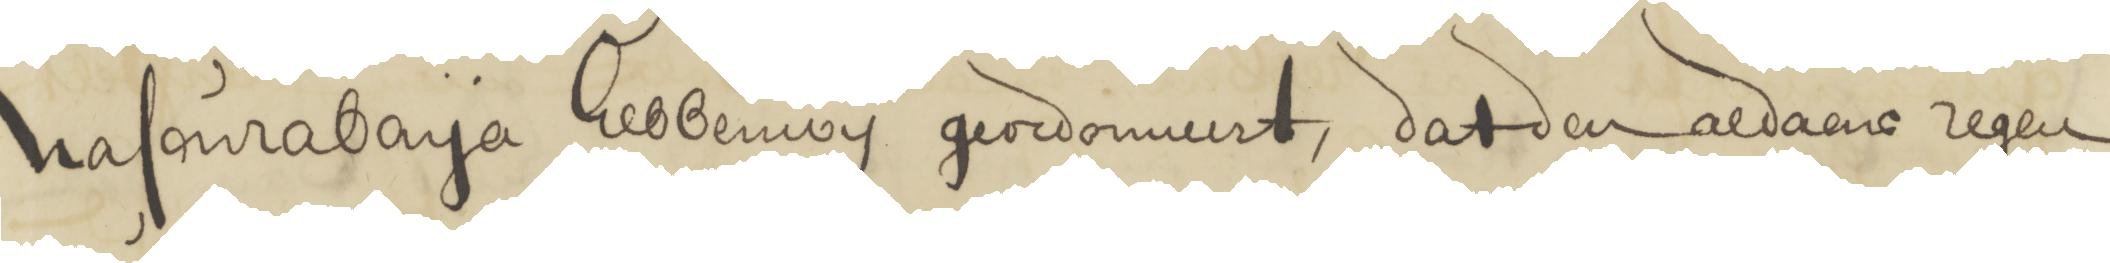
na sourabaija hebben wij geordonneert, dat den aldaar regen
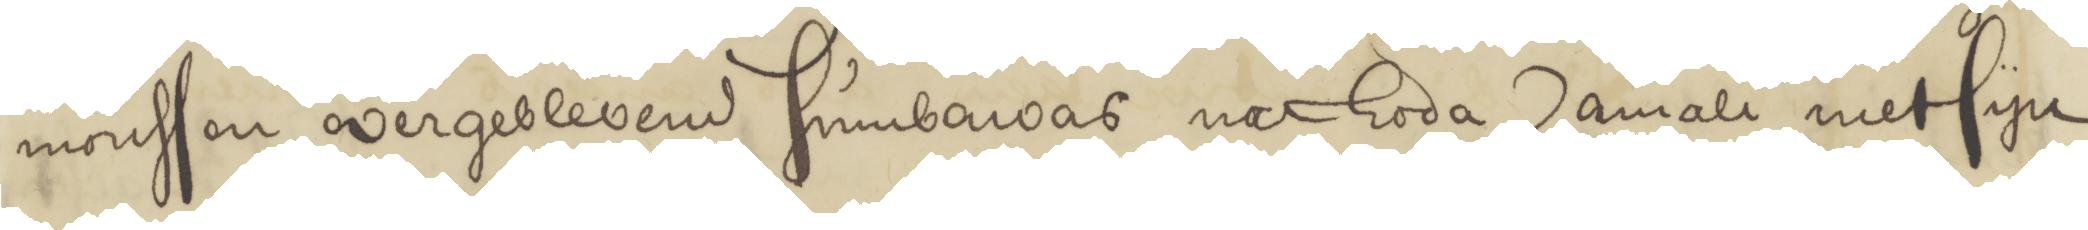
mousson overgeblevene sumbawas nachoda Jamali met sijn
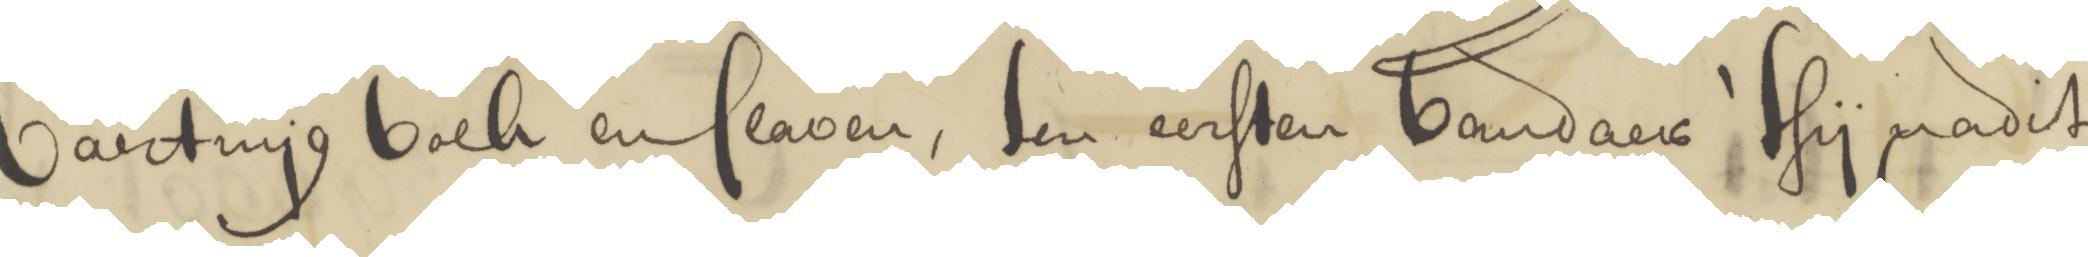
vaertuijg volk en slaven, ten eersten vandaer 'tsij na dit
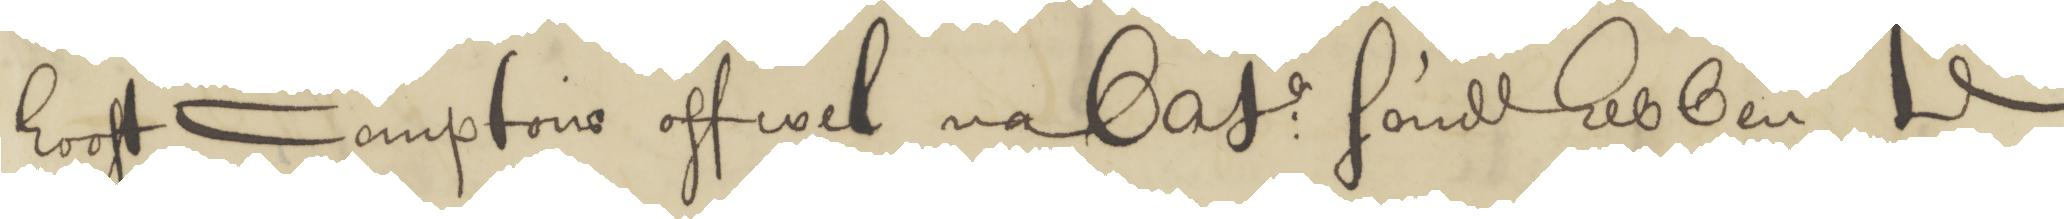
hooft comptoir off wel na bat:a soude hebben te
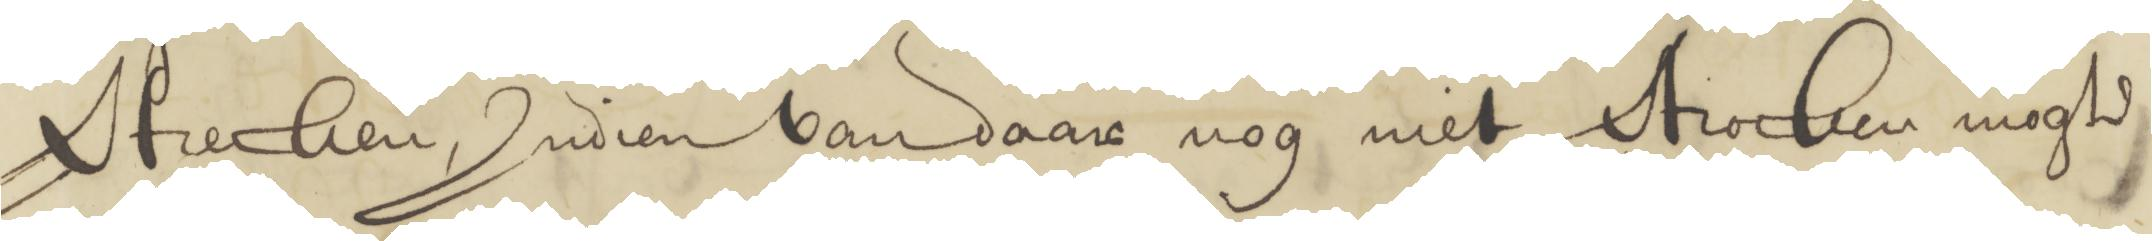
vertrecken, Jndien van daar nog niet vertrocken mogte
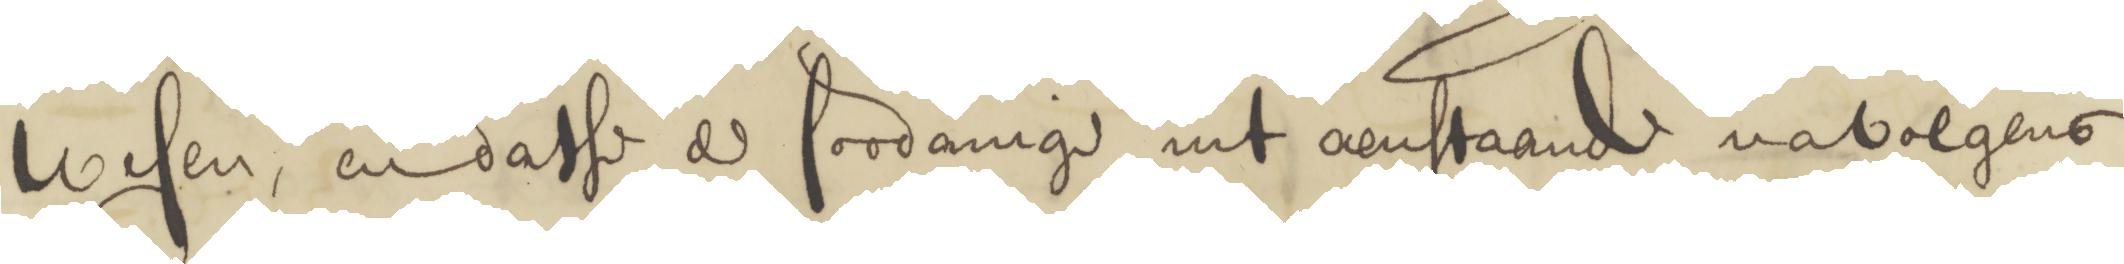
wesen, en datse de soodanige int aenstaande navolgens
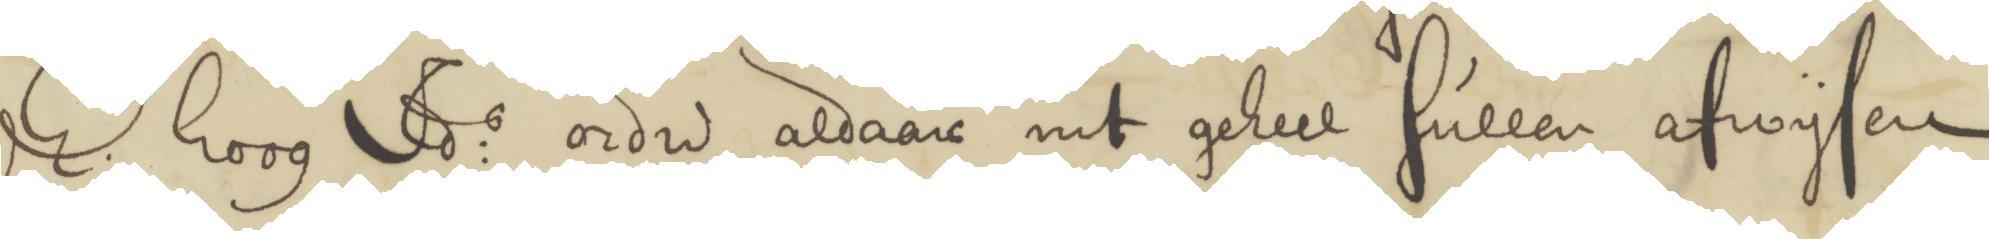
VE: hoog Ed:s ordre aldaar int geheel sullen afwijsen
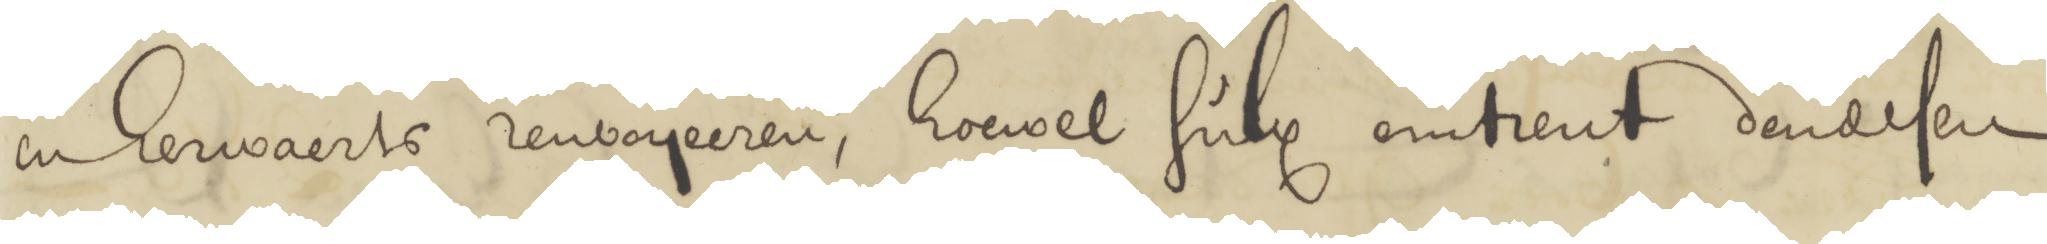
en herwaerts renvoijeeren, hoewel sulx omtrent den desen
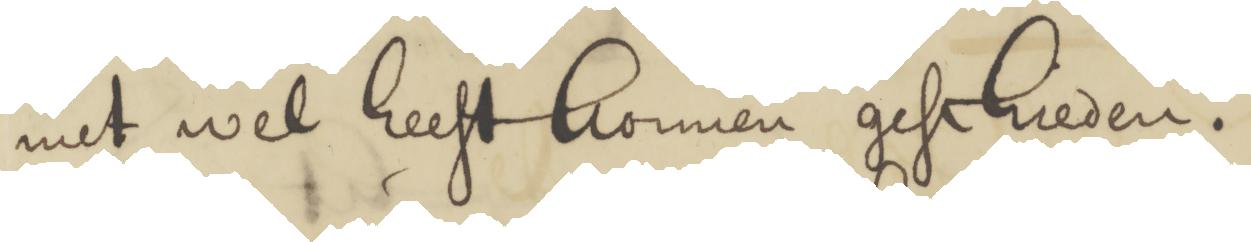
niet wel heeft konnen geschieden.
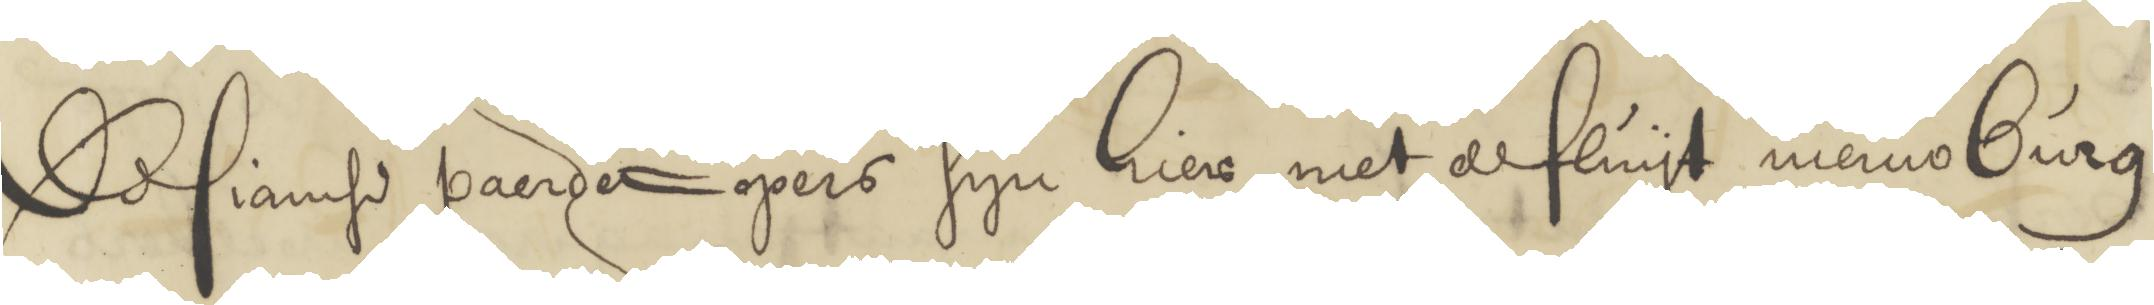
De siamse paerdecopers sijn hier met de fluijt nieuwburg
